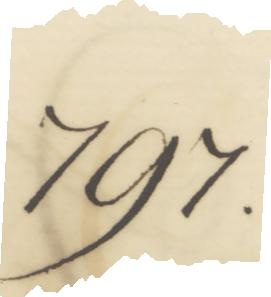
797.
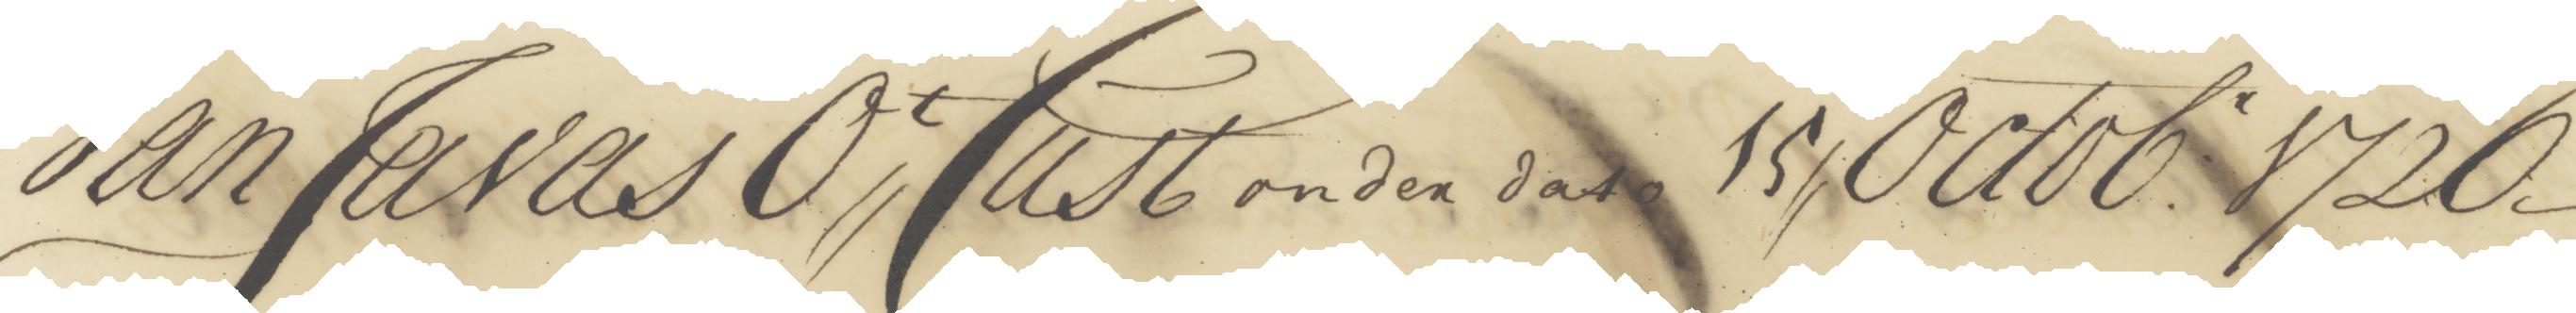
Van Java's O„t Cust onder dato 15„e Octob:r 1726
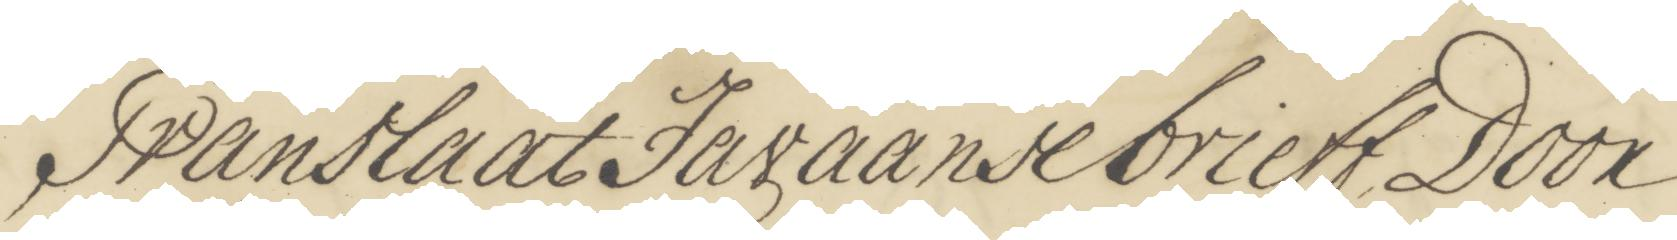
Translaat Javaanse brieff, Door
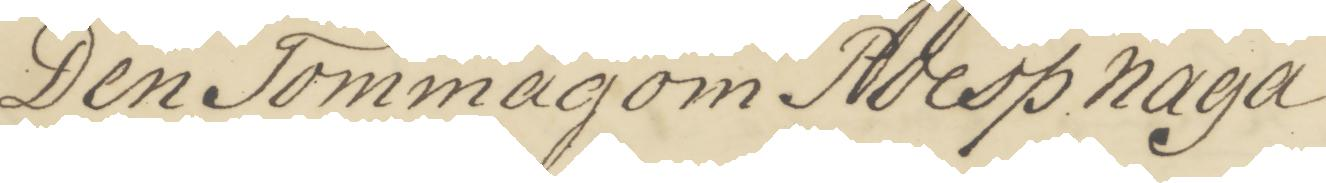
Den Tommagom Poesp naga
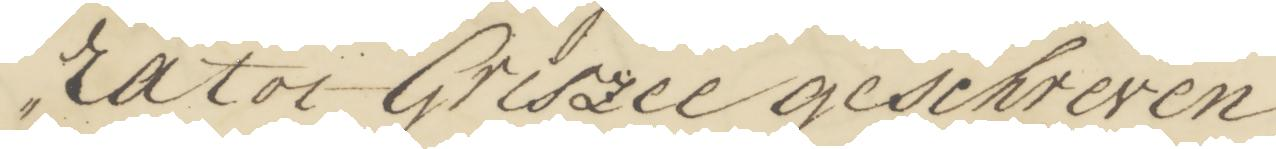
„ratoi Griszee geschreven
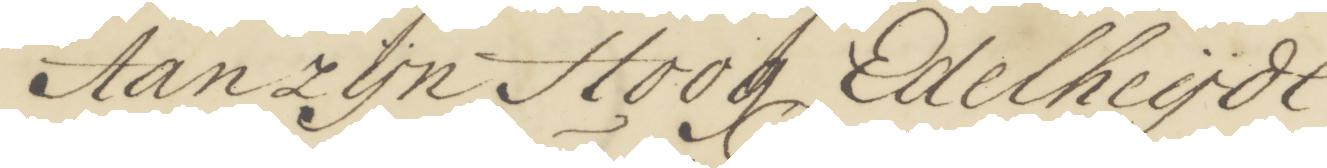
Aan zijn Hoog Edelheijdt
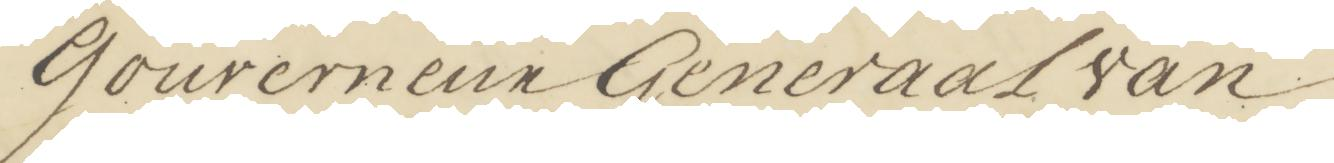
Gouverneur Generaal van
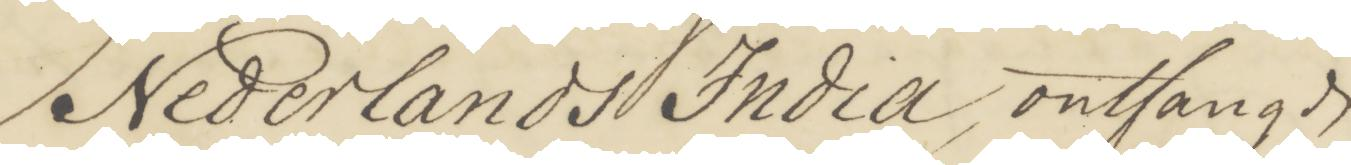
Nederlands India, ontfangen
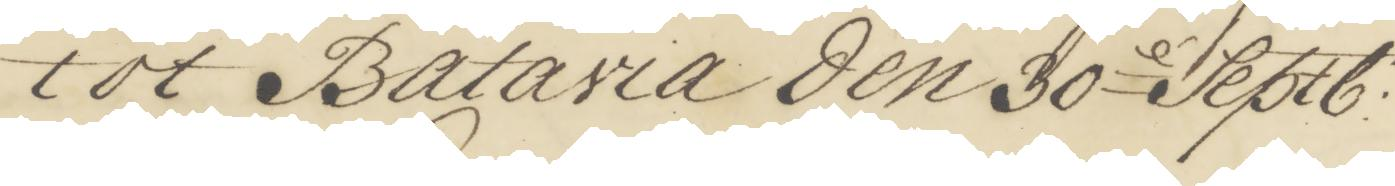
tot Batavia den 30=e Septb:r
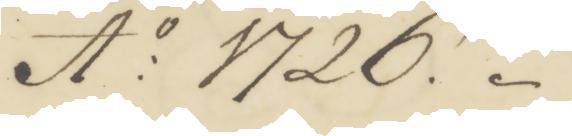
A:o 1726. —.
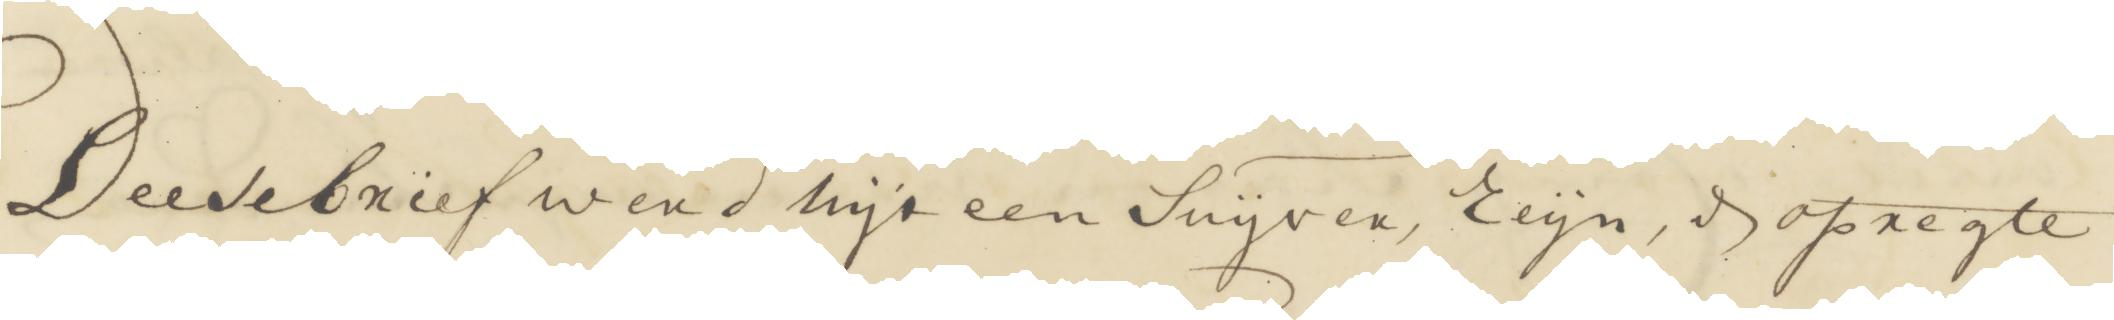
Deese brief werd uijt een suijver, reijn, en opregte
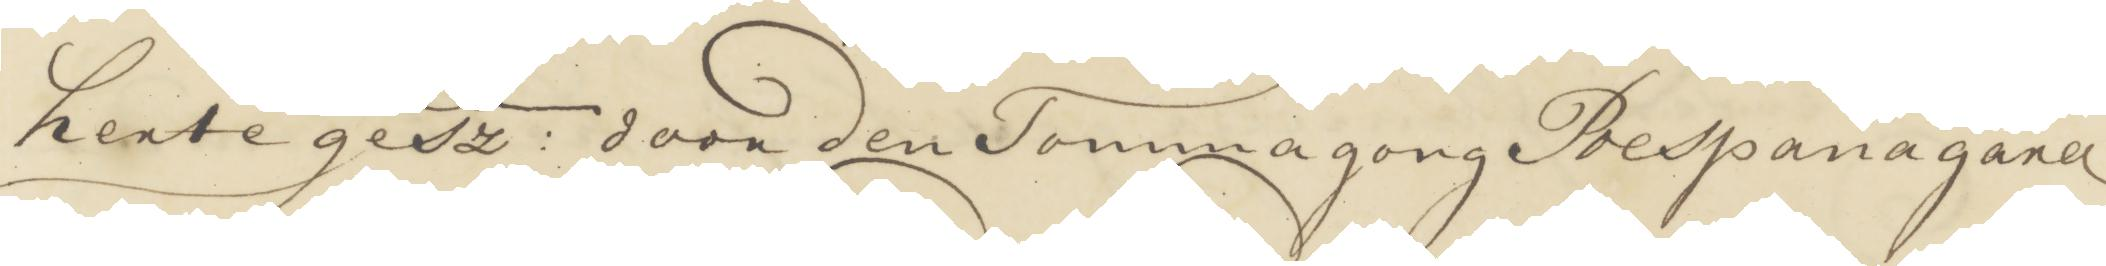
herte gesz: door den Tommagong Poespanagara
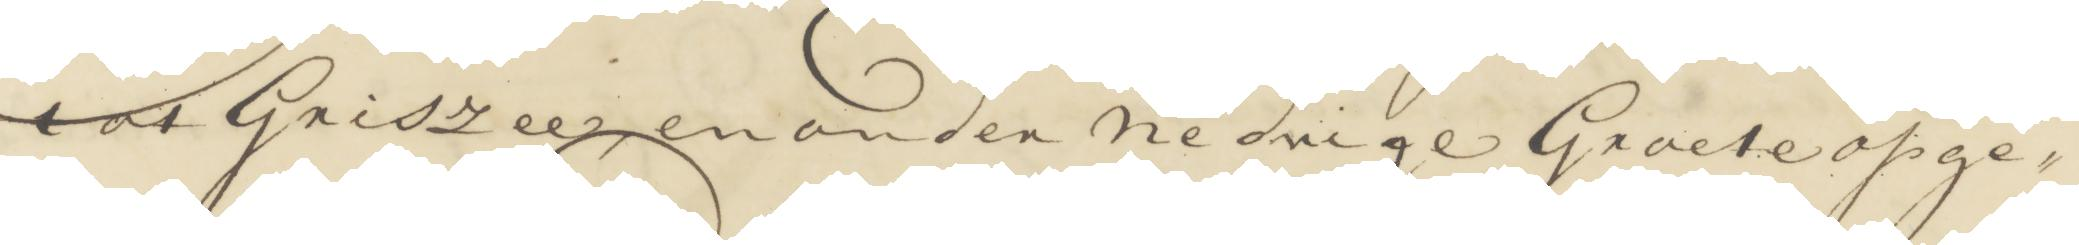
tot Griszee, en onder nedrige Groete opge„
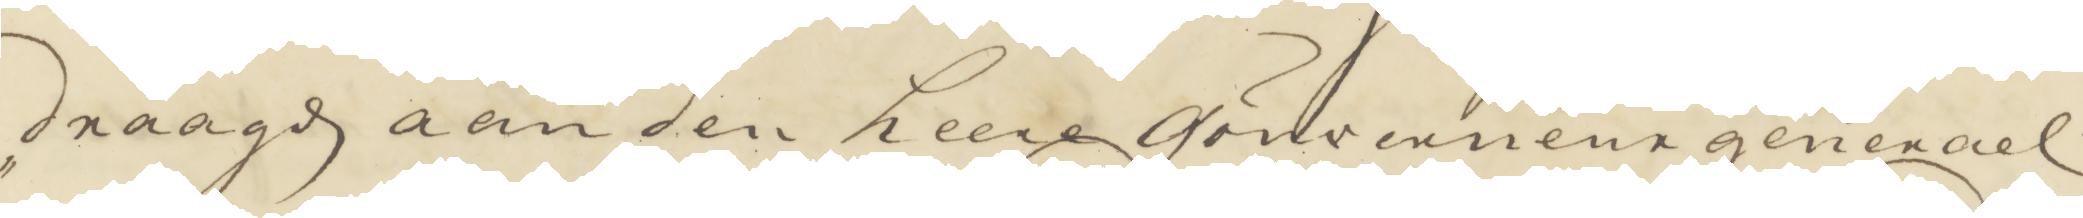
„draagen aan den heere gouverneur generael
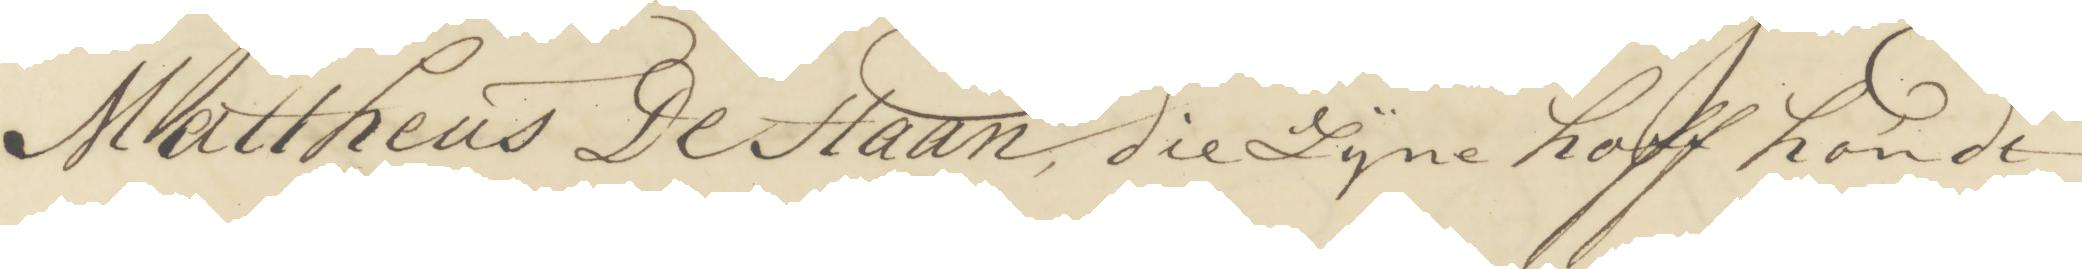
Mattheus De Haan, die zijne hoff houdt
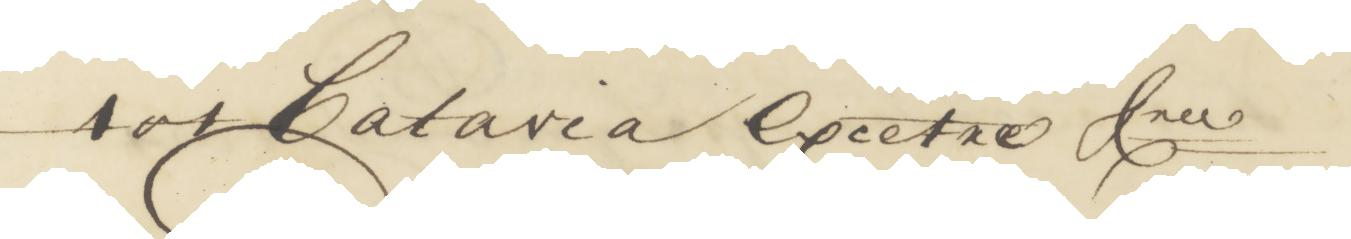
tot batavia excetra e-ra
